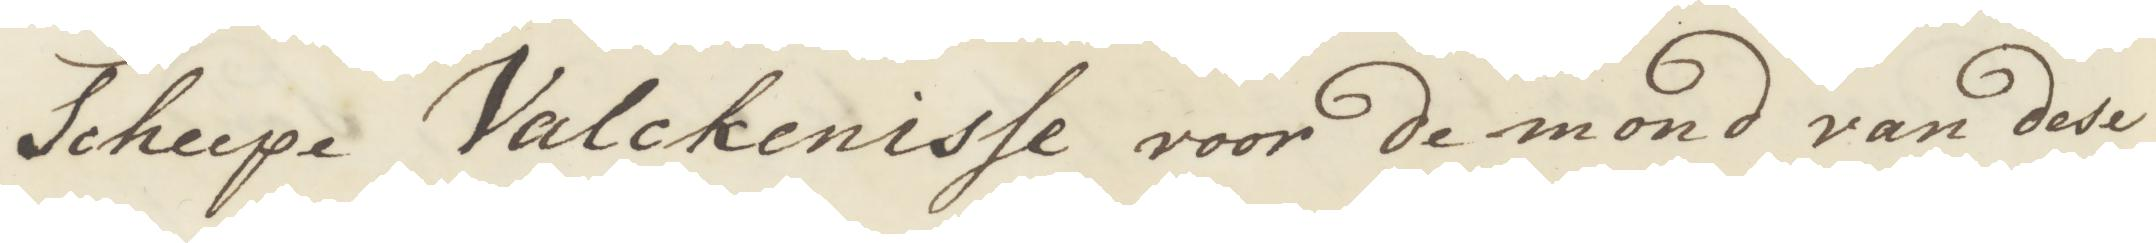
scheepe Valckenisse voor de mond van dese
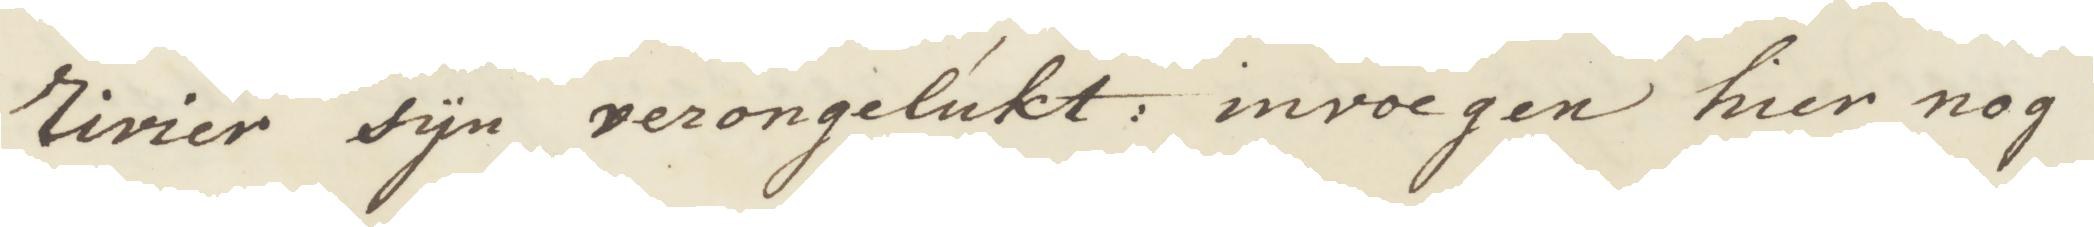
rivier sijn verongelukt: invoegen hier nog
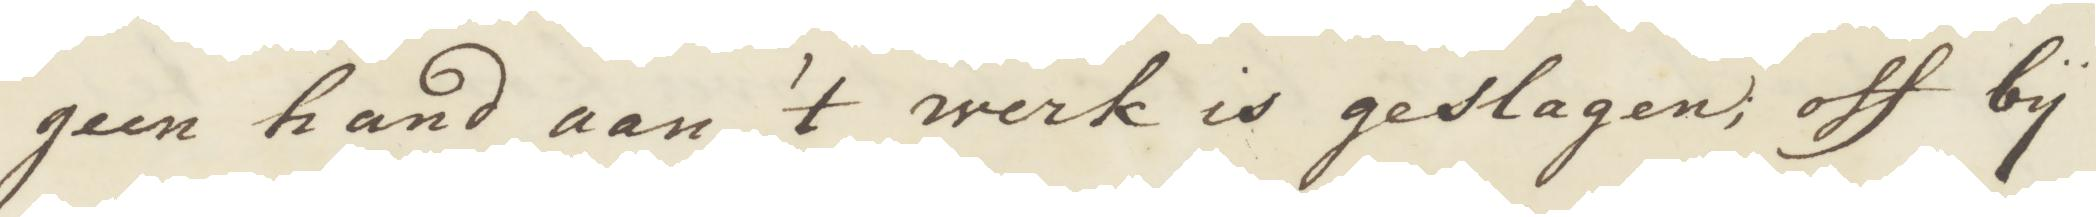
geen hand aan ’t werk is geslagen; off bij
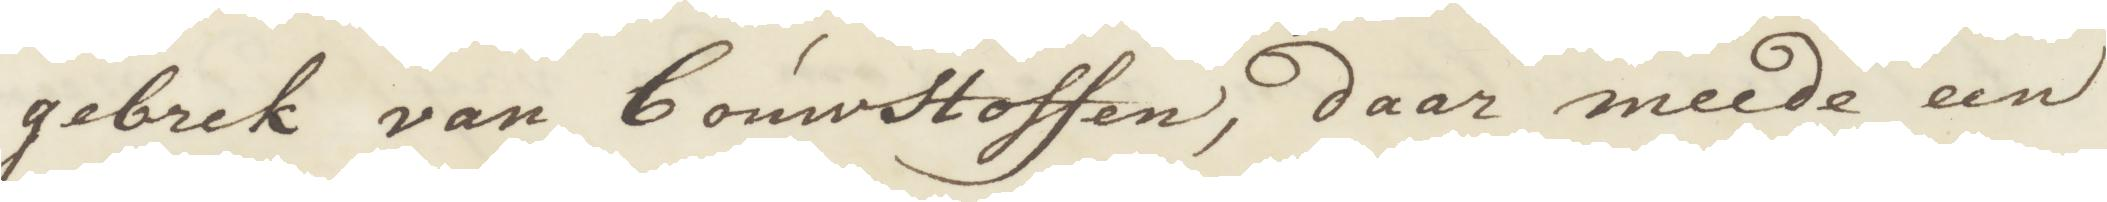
gebrek van bouwstoffen, daar meede een
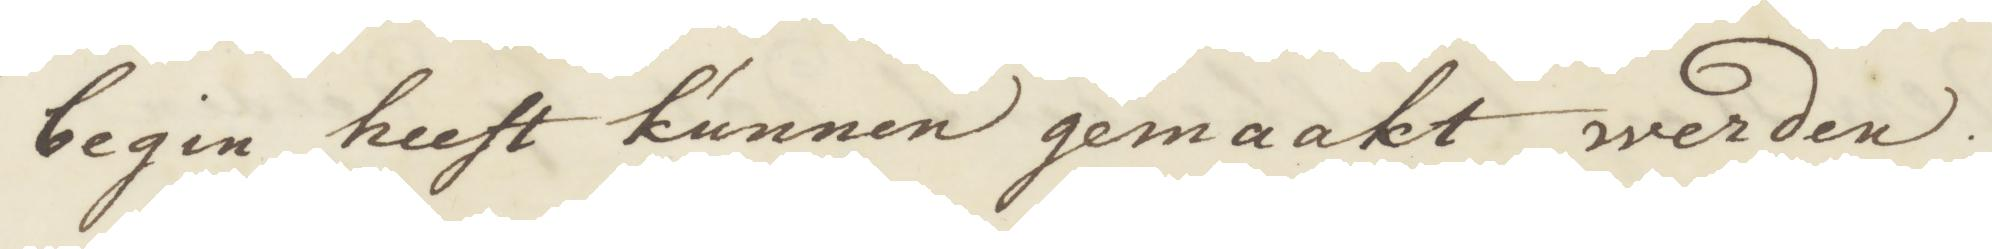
begin heeft kunnen gemaakt werden.
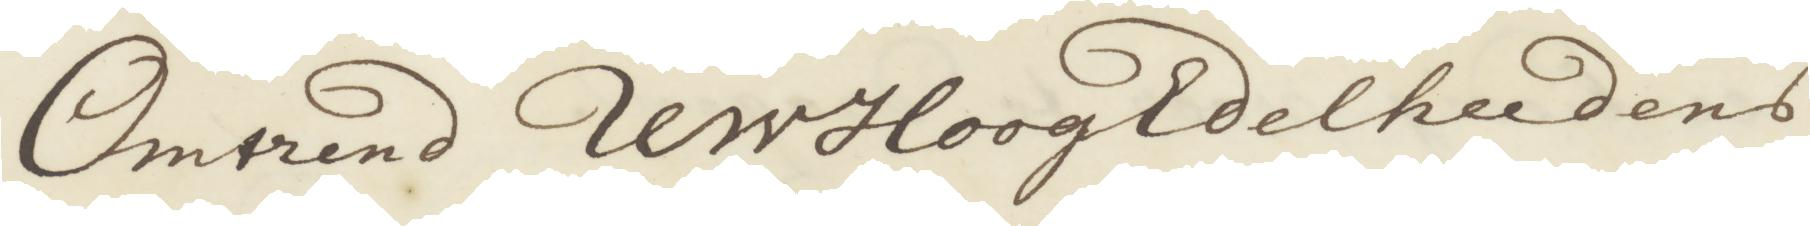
Omtrend UWHoog Edelheedens
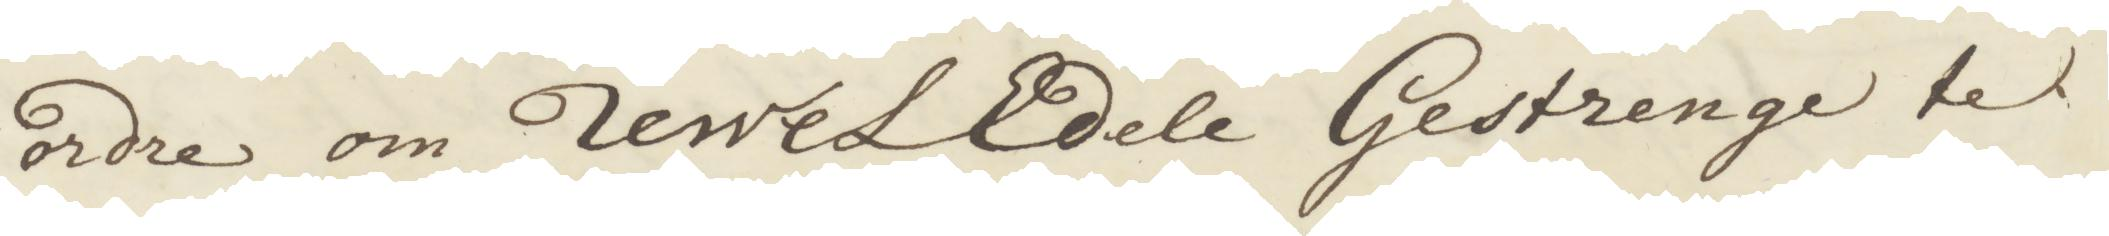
ordre om UWel Edele Gestrenge te
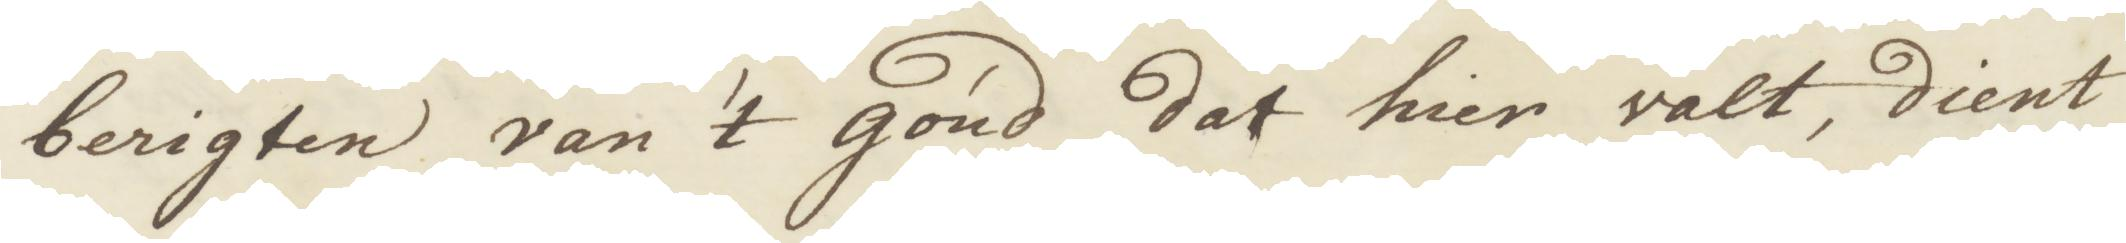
berigten van ’t goud dat hier valt, dient
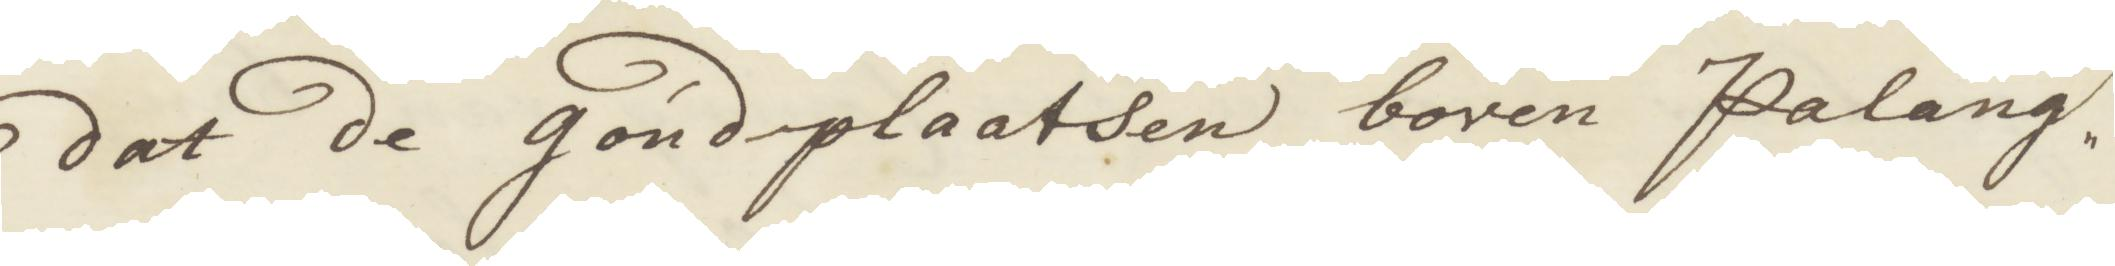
dat de goudplaatsen boven Palang„
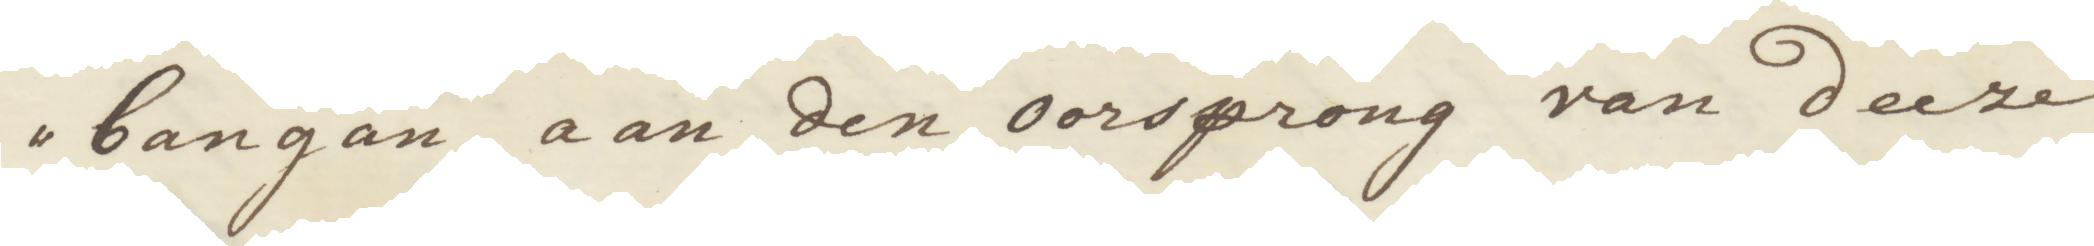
„bangan aan den oorsprong van deeze
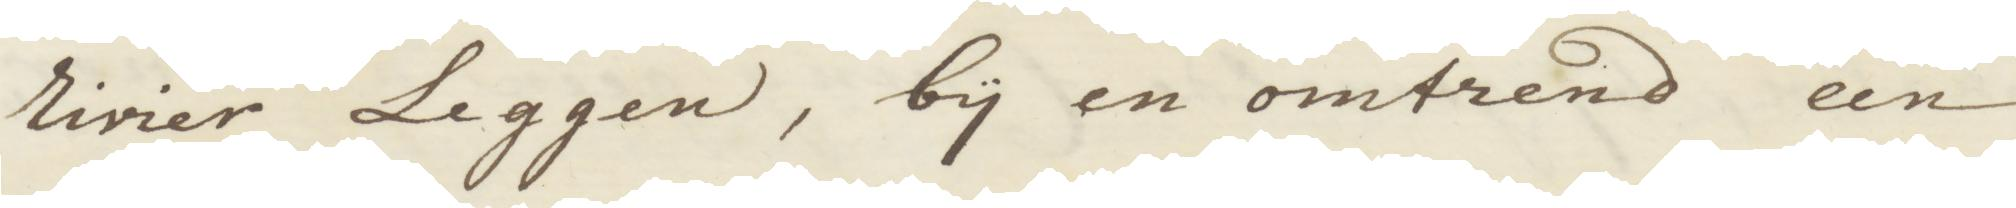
rivier leggen, bij en omtrend een
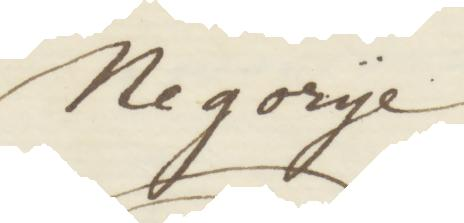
Negorije
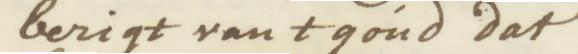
berigt van t goud dat
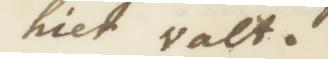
hier valt.
